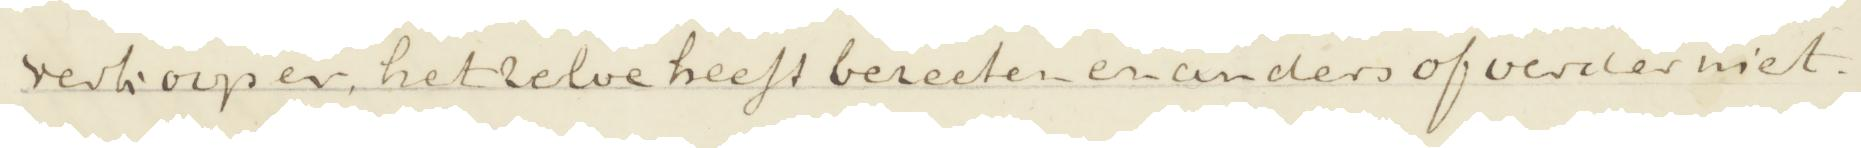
verkooper, het zelve heeft bezeeten en anders of verder niet.
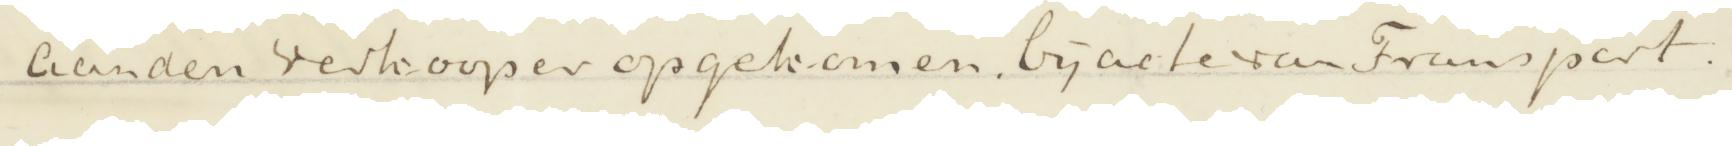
Aan den Verkooper opgekomen, bij acte van Transport.
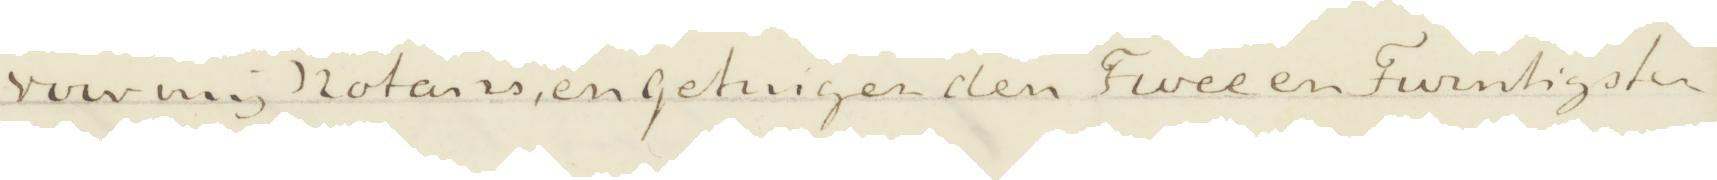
voor mij Notaris, en Getuigen den Twee en Twintigsten
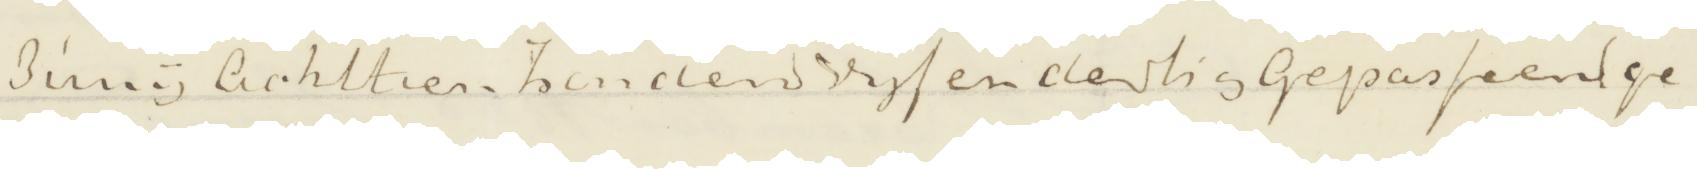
Iunij Achttien honderd Vyf en dertig Gepasseerd ge
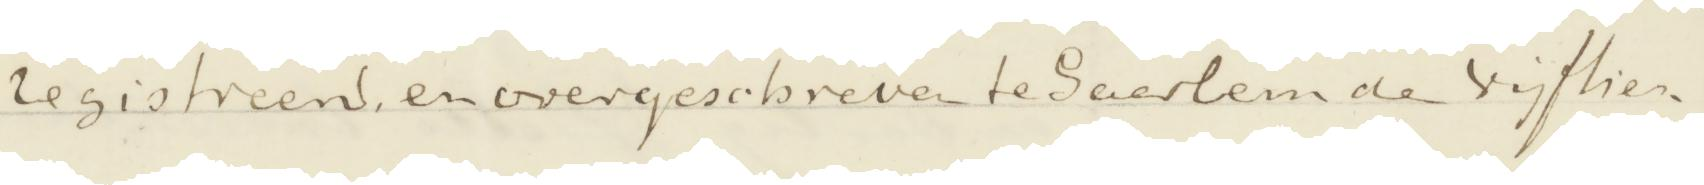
registreerd, en overgeschreven te Haarlem de vijftien
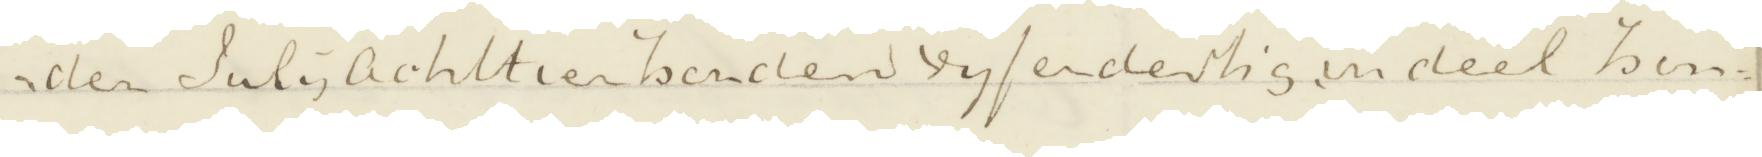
,den Iulij Achttien honderd Vyf en dertig, in deel hon„
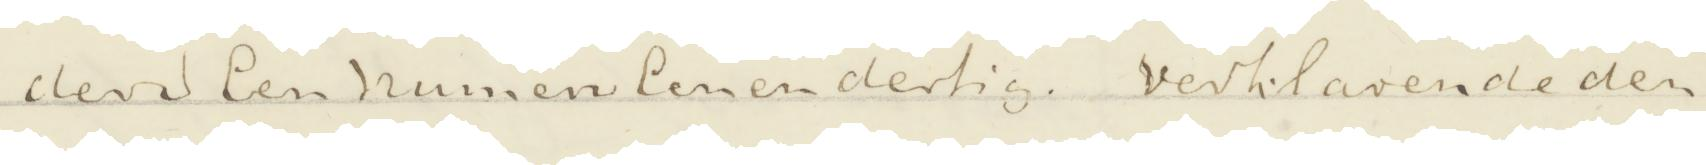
derd Een Numero Een en dertig. Verklarende den
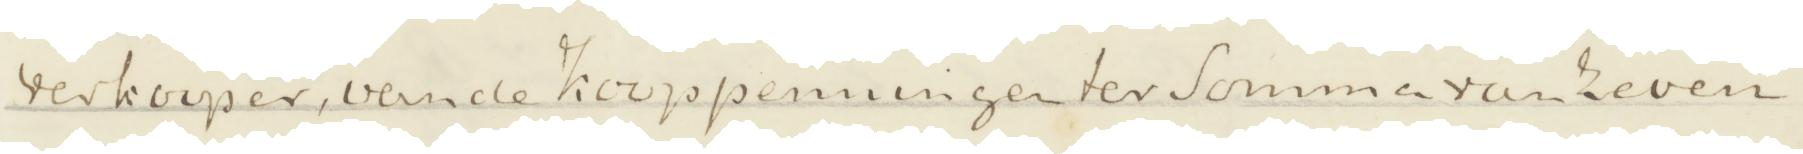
Verkooper, van de kooppenningen ter Somma van zeven
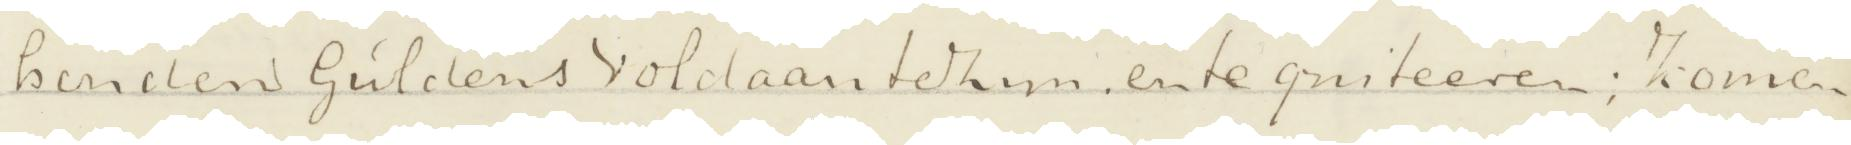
honderd Guldens Voldaan te zyn, en te quiteeren; Komen
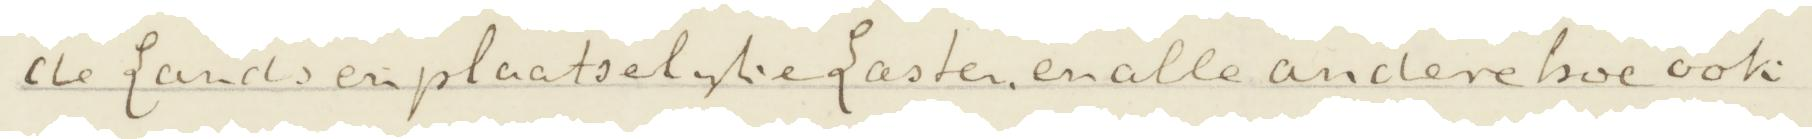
de Lands en plaatselyke Lasten en alle andere hoe ook
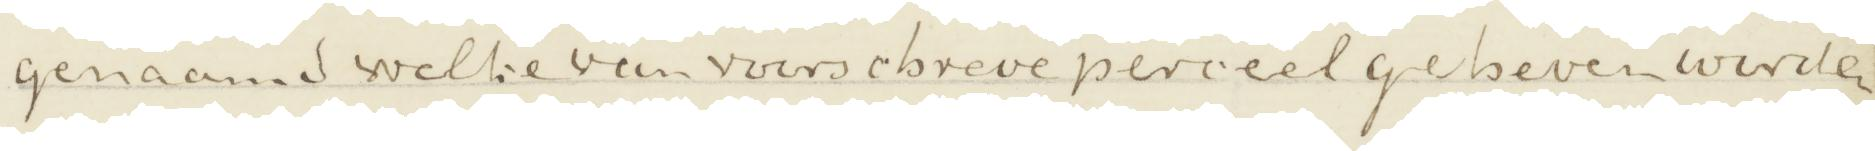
genaamd welke van voorschreve perceel geheven worden
